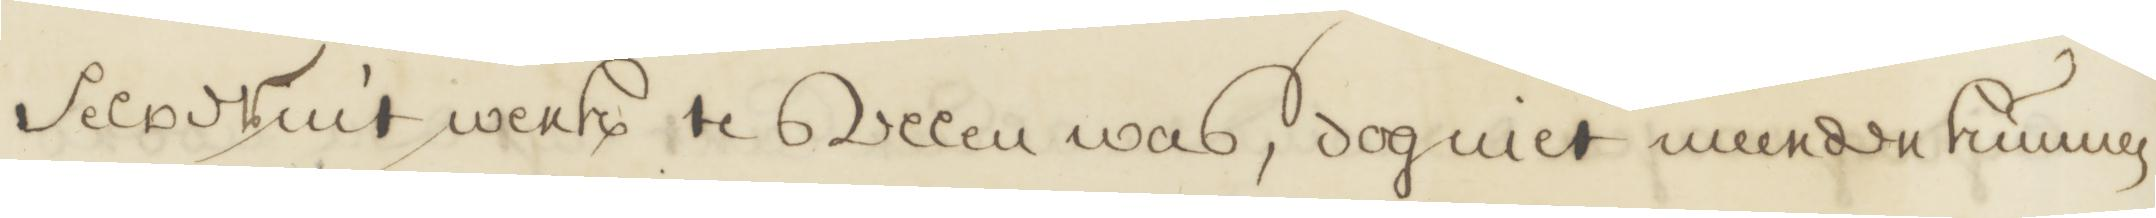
selver in't werk te stellen was, dog niet meerder kunnen
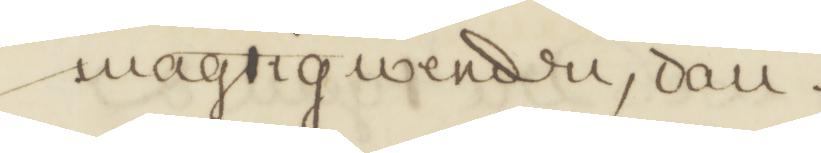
magtig werden, dan.
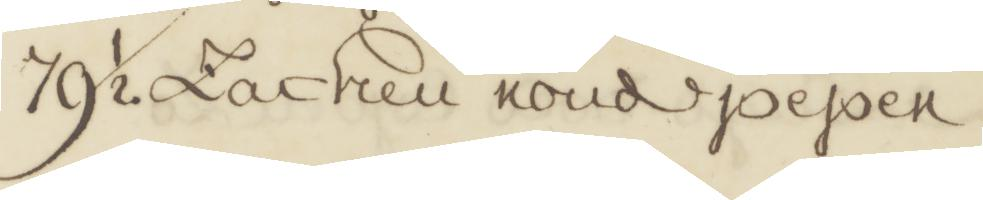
79½. Zacken ronde peper
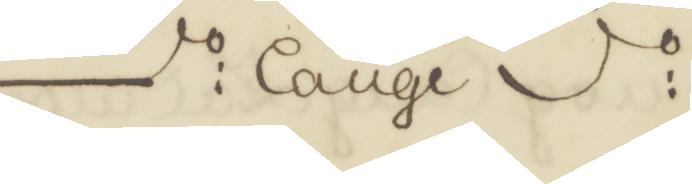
5–. _:o lange _:o
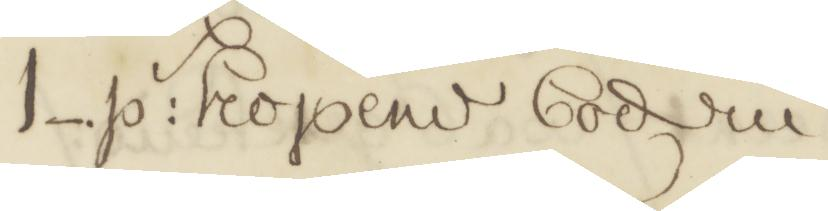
1–. p:s kopere bodem
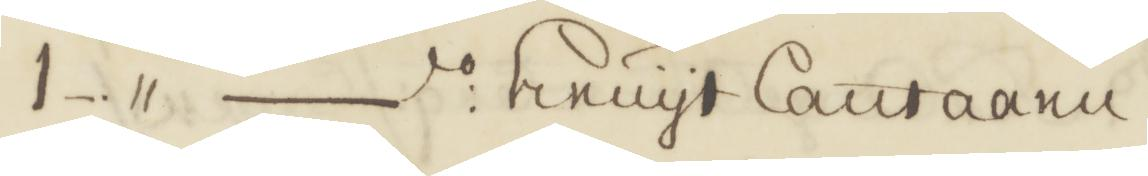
1–. „ _:o kruijt lantaarn
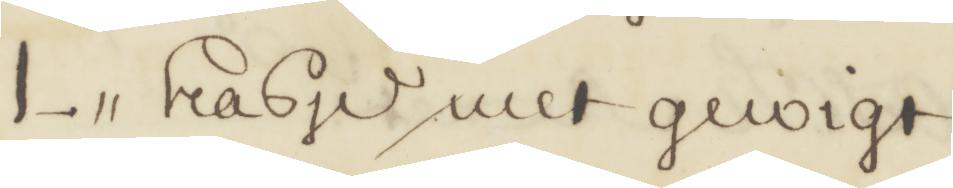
1–. „ kasje niet gewigt
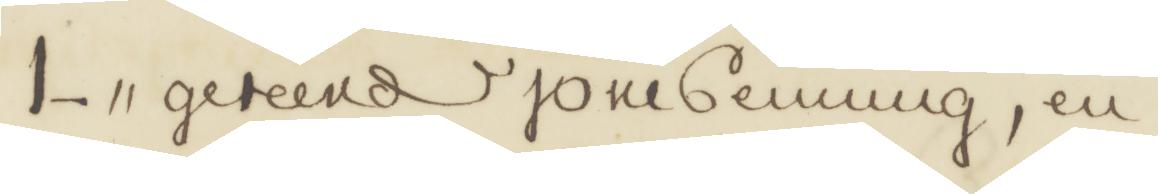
1– „ geteerde presenning, en
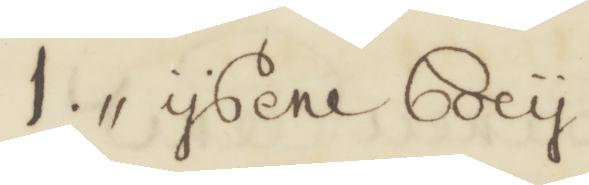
1. „ ijsere boeij
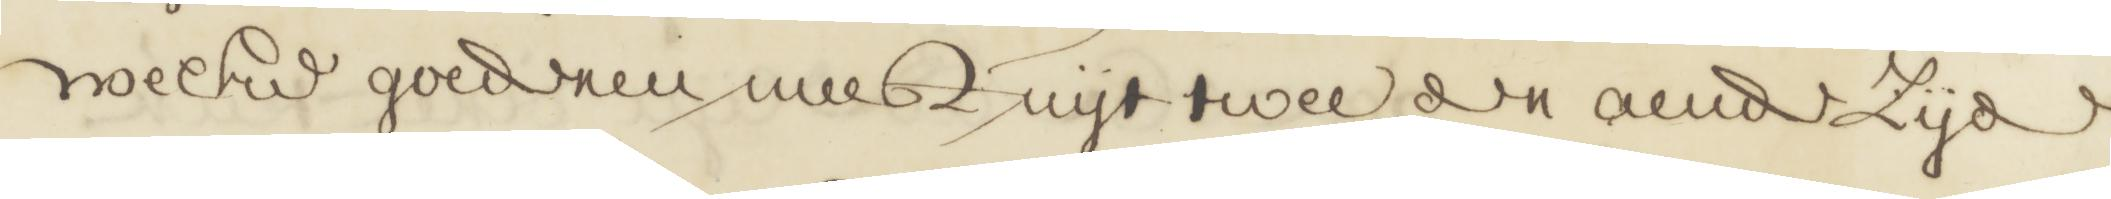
welke goederen meest uijt twee der aende zijde
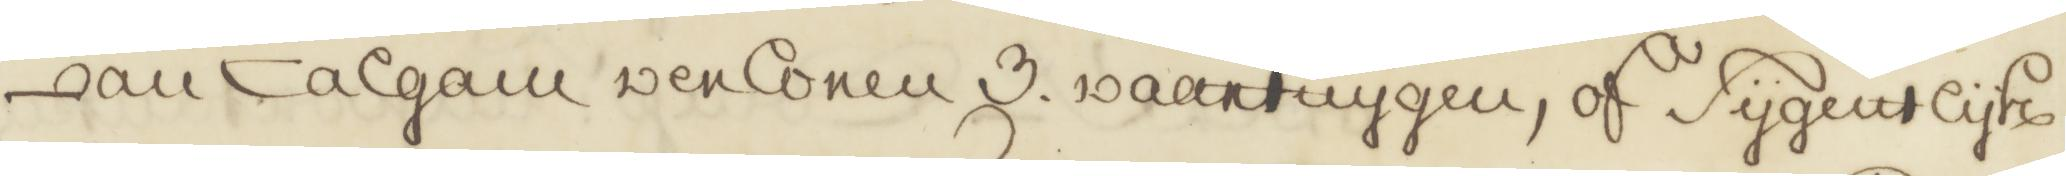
van Calgam verloren 3. vaartuijgen, of Eijgentlijk
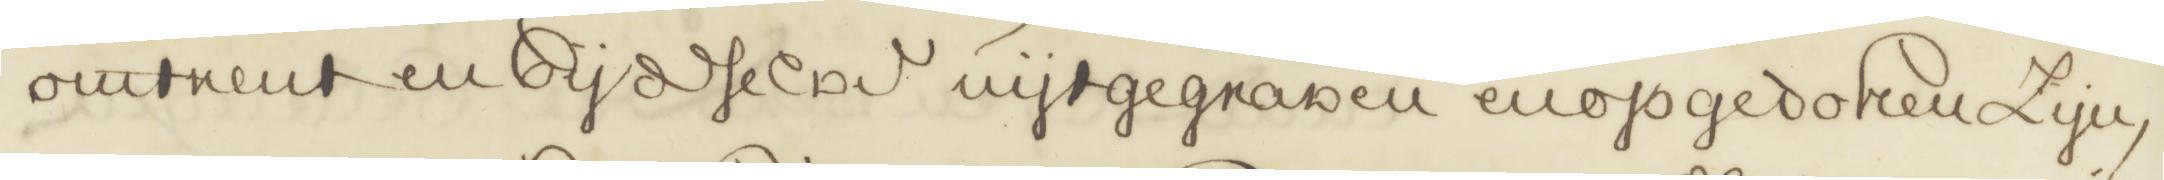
omtrent en bij deselve uijtgegraven en opgedoken zijn,
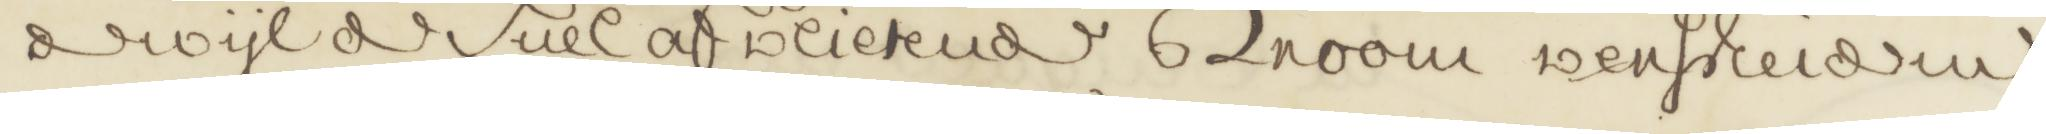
dewijl de Snel afvlietende stroom verscheidene
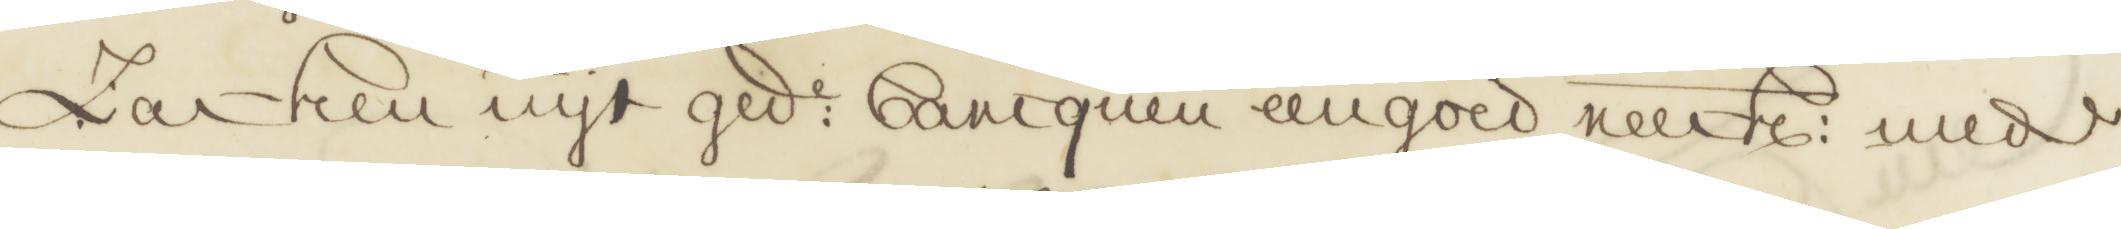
zacken uijt ged:e barcquen een goed reeck: mede
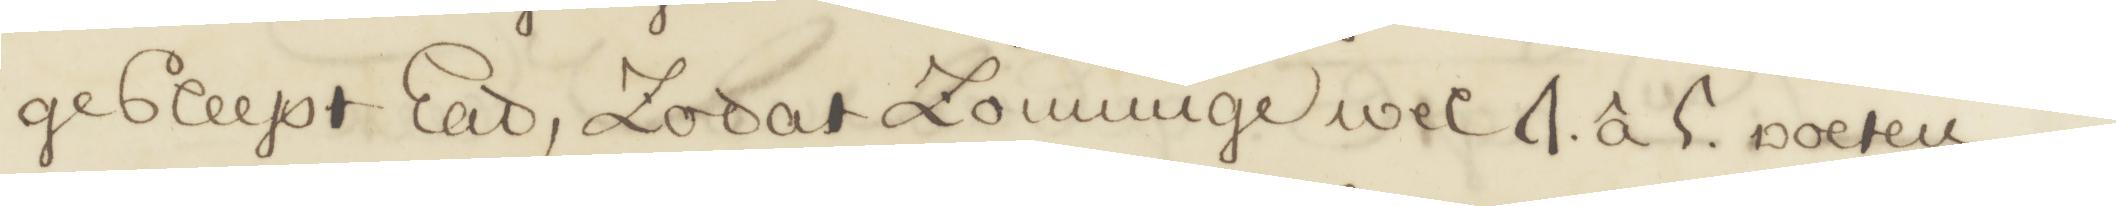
gesleept had, zodat zommige wel 4. â 5. voeten. –
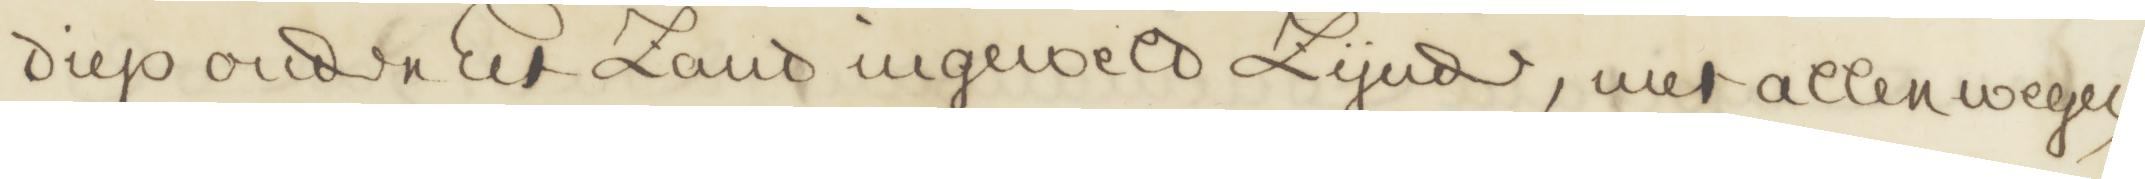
diep onder het zand ingeweld zijnde, niet aller wegen
